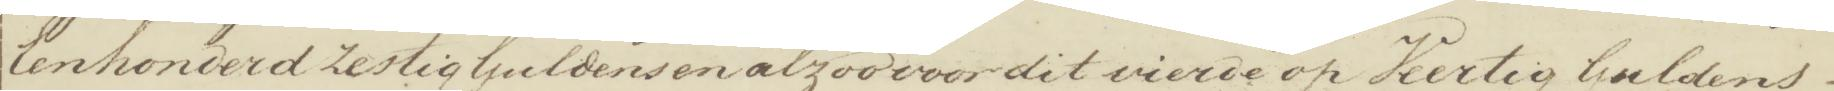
Een honderd Zestig Guldens en alzoo voor dit vierde op Veertig Guldens.
